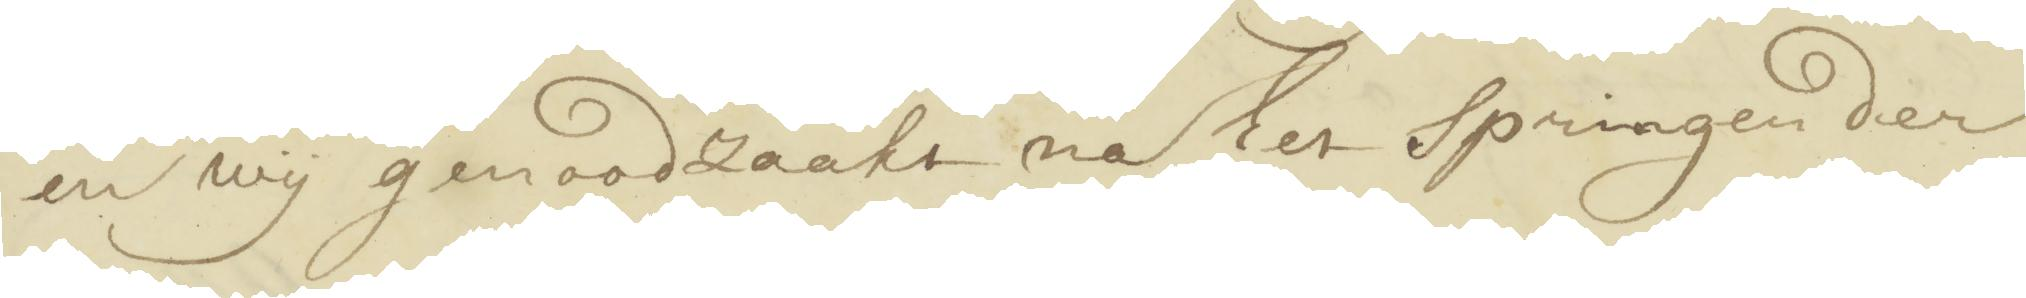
en wij genoodzaakt na het springen der
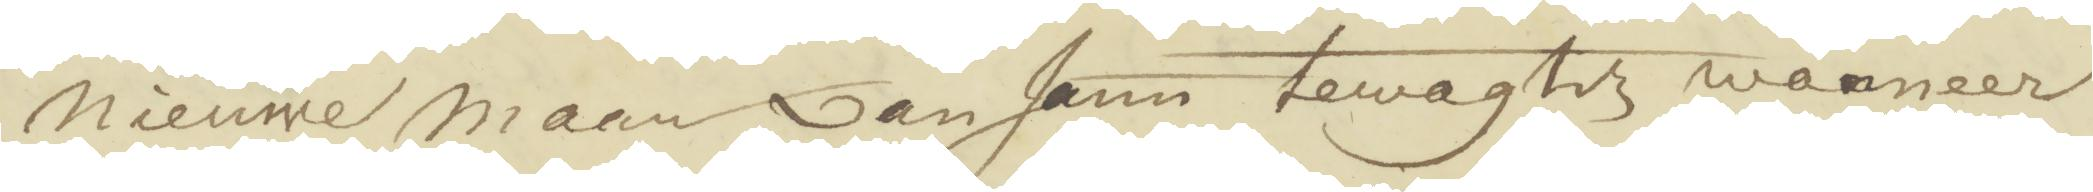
nieuwe maan van Jann tewagten wanneer
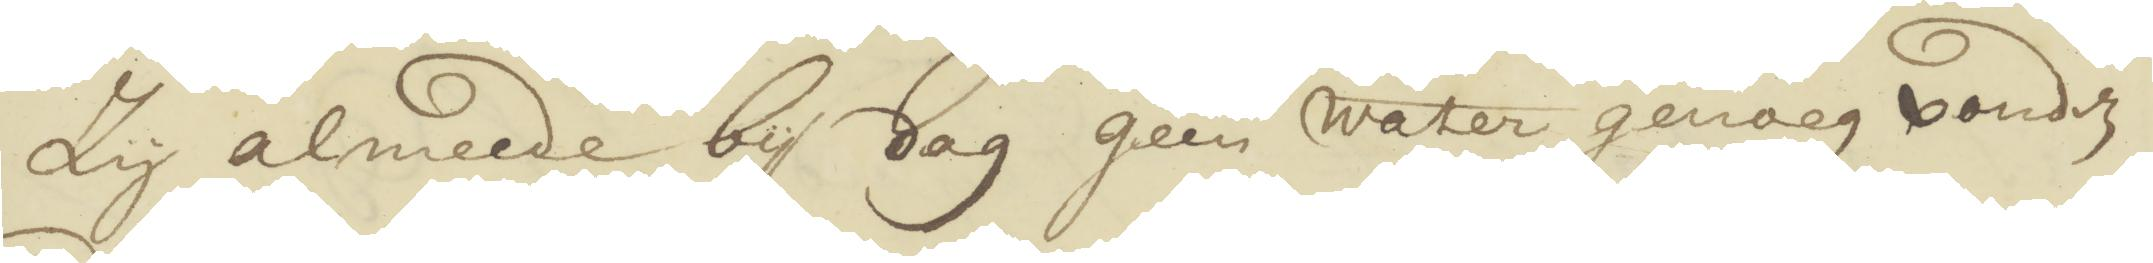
zij almeede bij dag geen water genoeg vonden
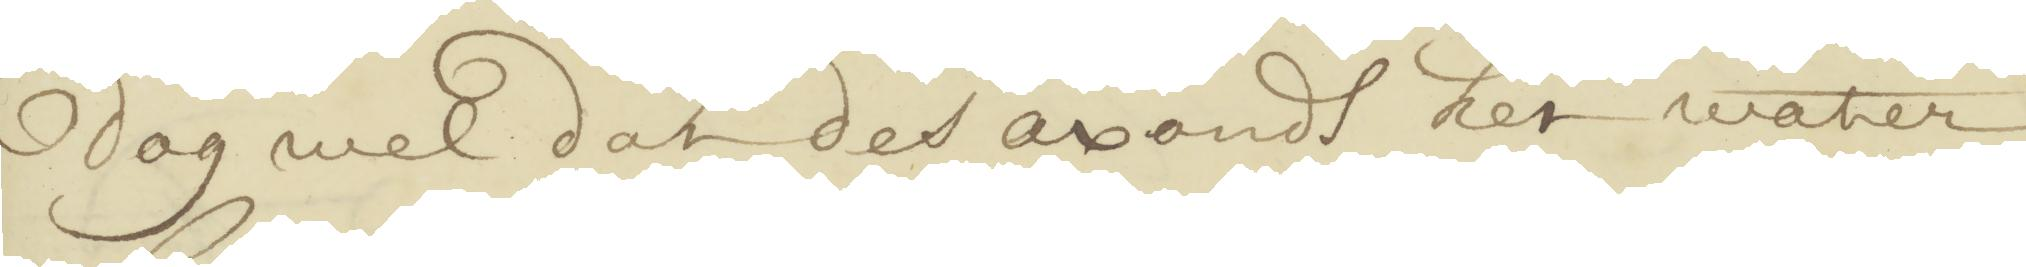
dog wel dat des avonds het water
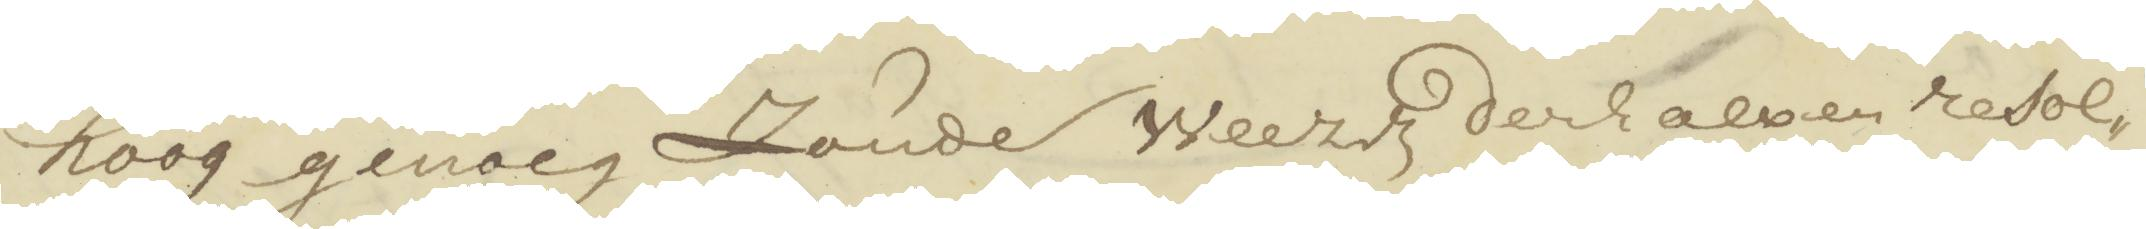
hoog genoeg zoude weezen derhalven resol„
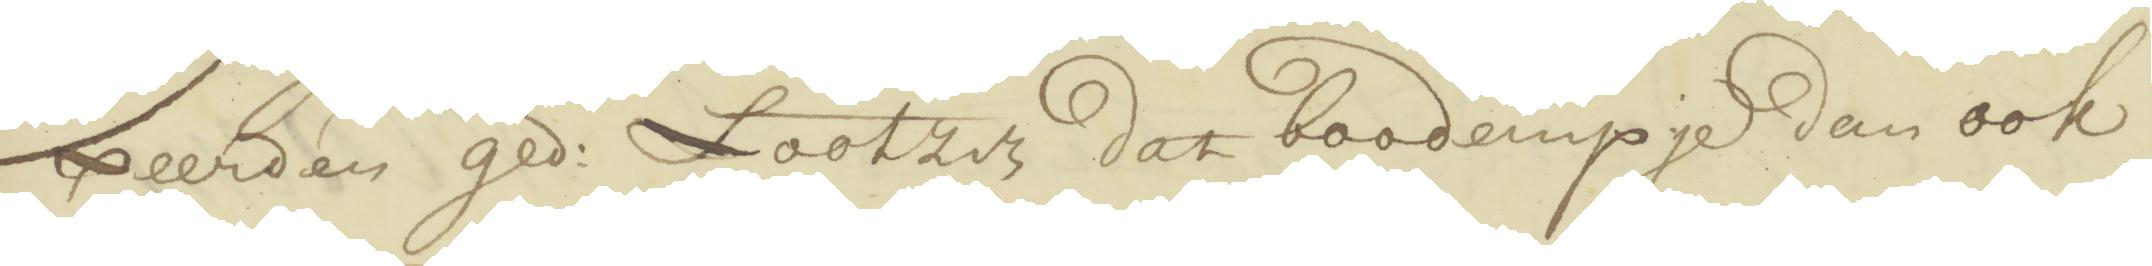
veerden ged: Lootzen dat boodempje dan ook
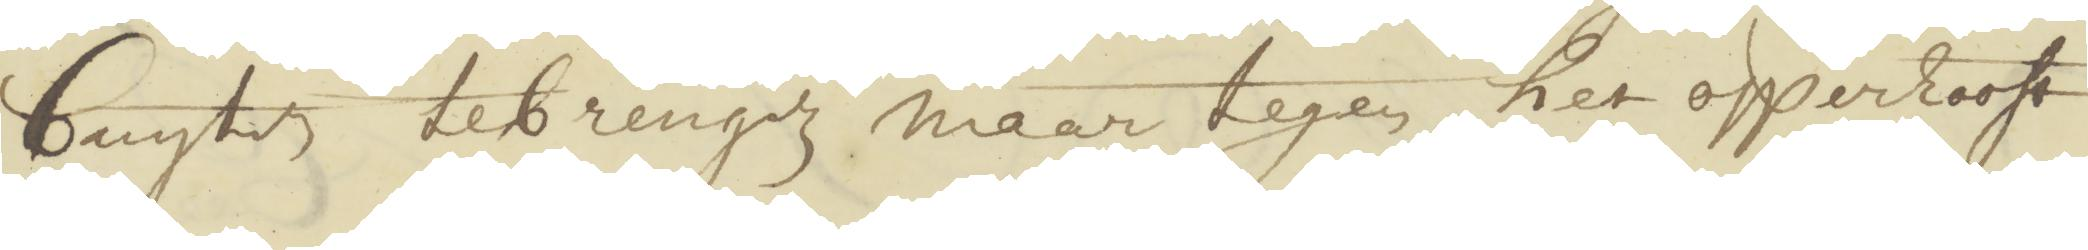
buyten te brengen maar tegen het opperhooft
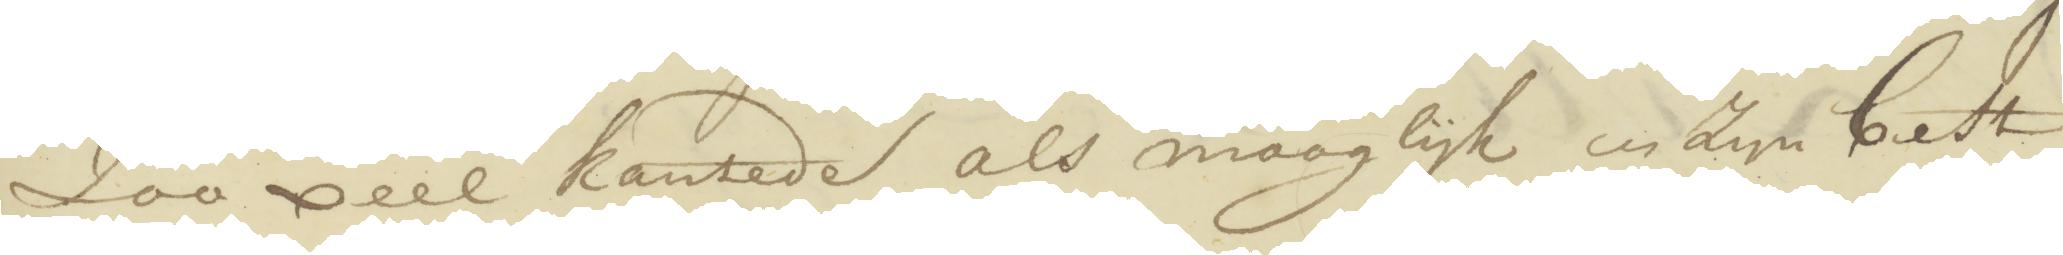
zoo veel kantede als mooglijk en zyn best
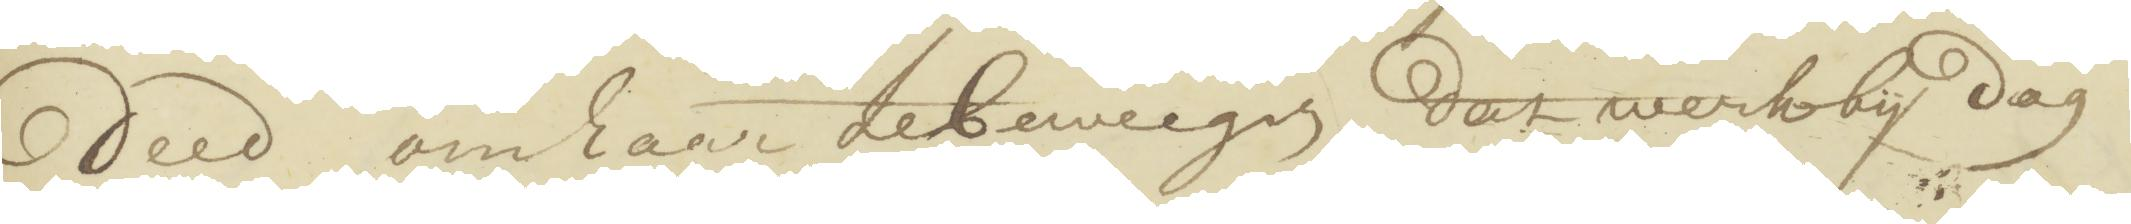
deed om haar te beweegen dat werk bij dag
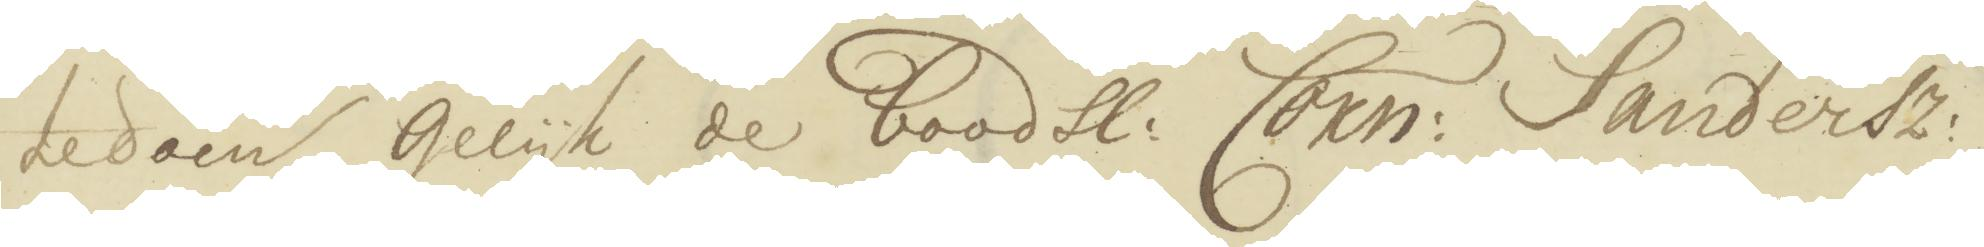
te doen gelijk de boodsl: Corn: Sandersz:
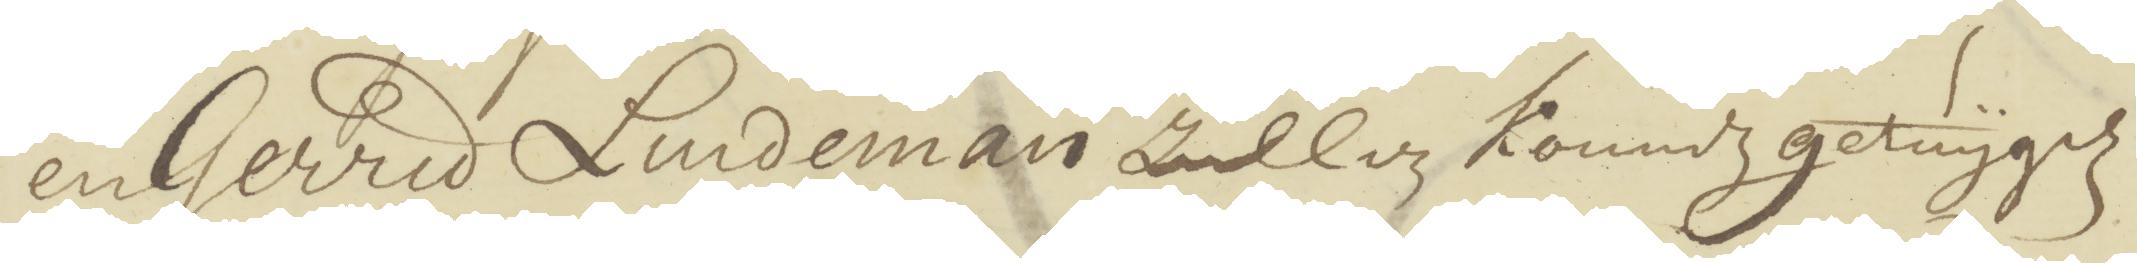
en Gerrid Lindeman zullen konnen getuijgen
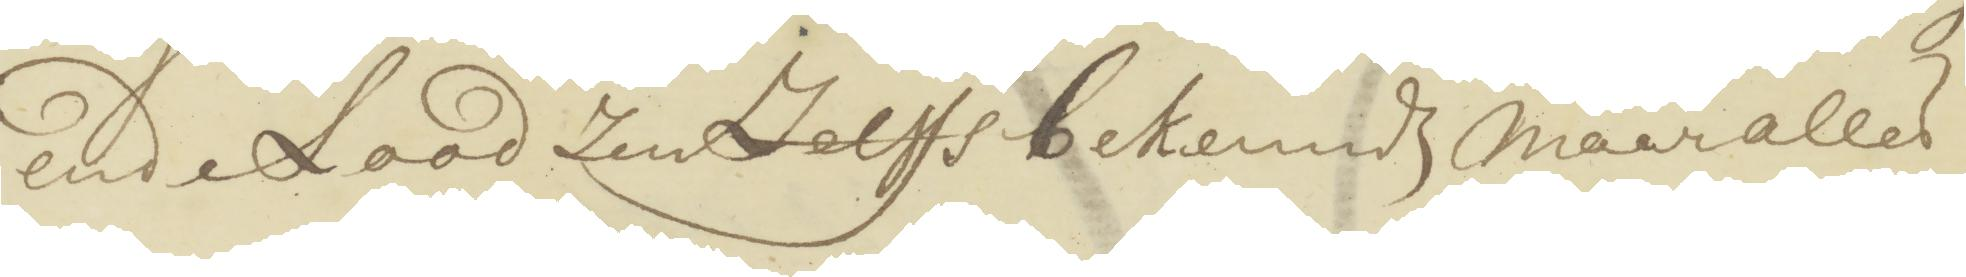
ende Loodzen Zelffs bekennen maar alles
